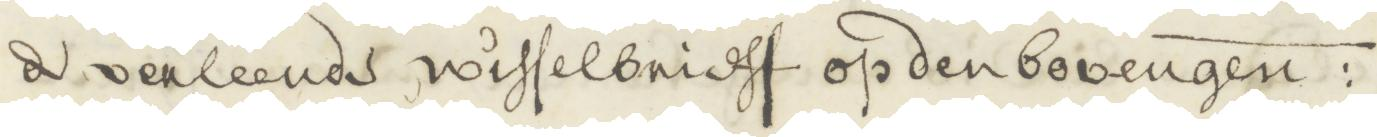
de verleende wisselbrieff op den bovengen:
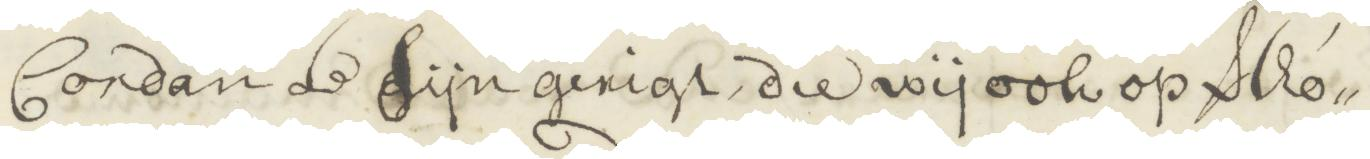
Cordan te sijn gerigt, die wij ook op vertho„
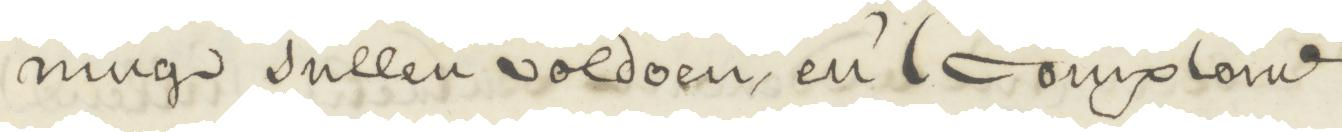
ninge sullen voldoen, en ’t comptoire
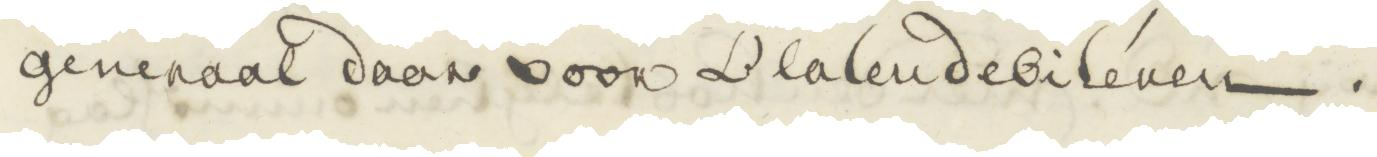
generaal daar voor te laten debiteren.
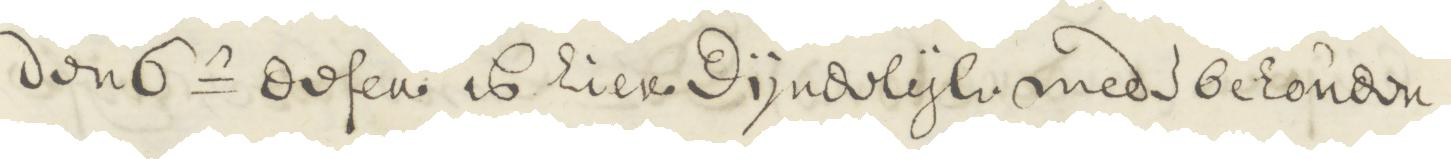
den 6=en deser is hier Eijndelijk mede behouden
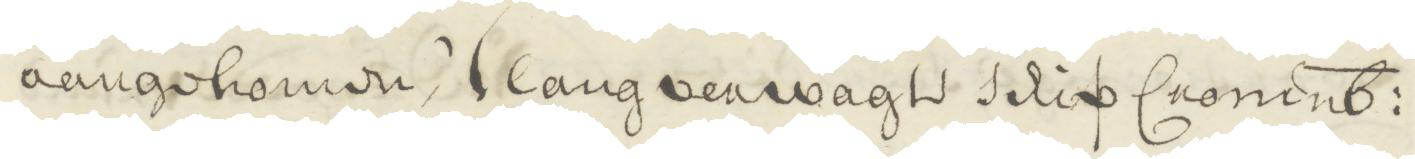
aangekomen, ’t lang verwagte schip Cronenb:
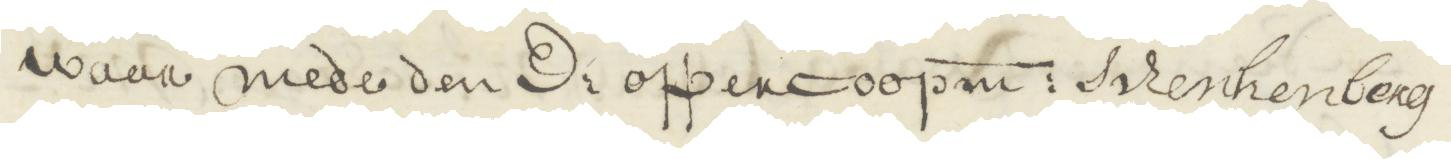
waar mede den E: oppercoopm: schenkenberg
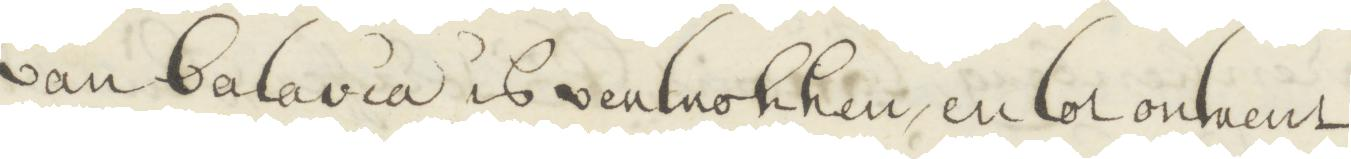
van batavia is vertrokken, en tot ontrent
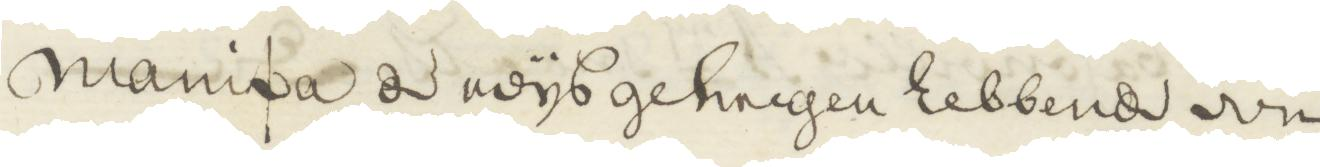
manipa de reijs gekregen hebbende een
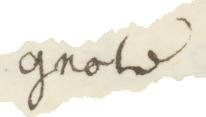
grote
